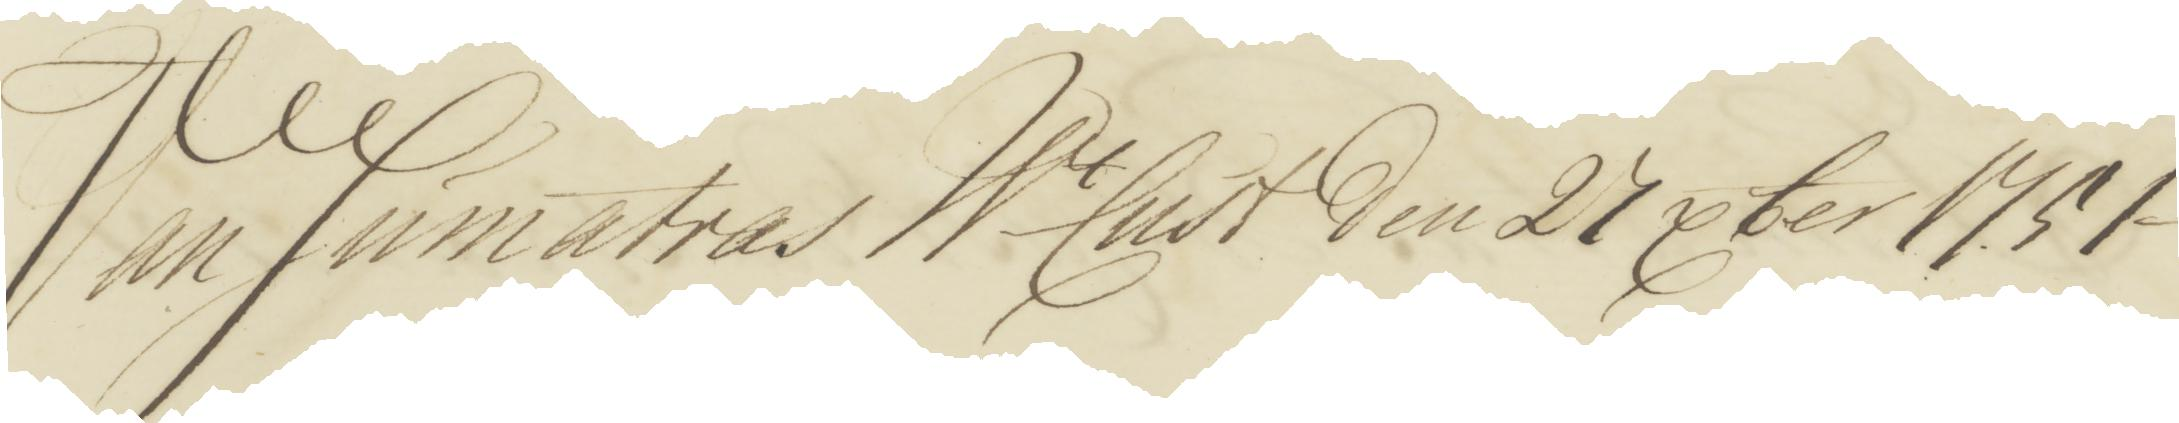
Van Sumatras W:t Cust den 22 xber 1751.
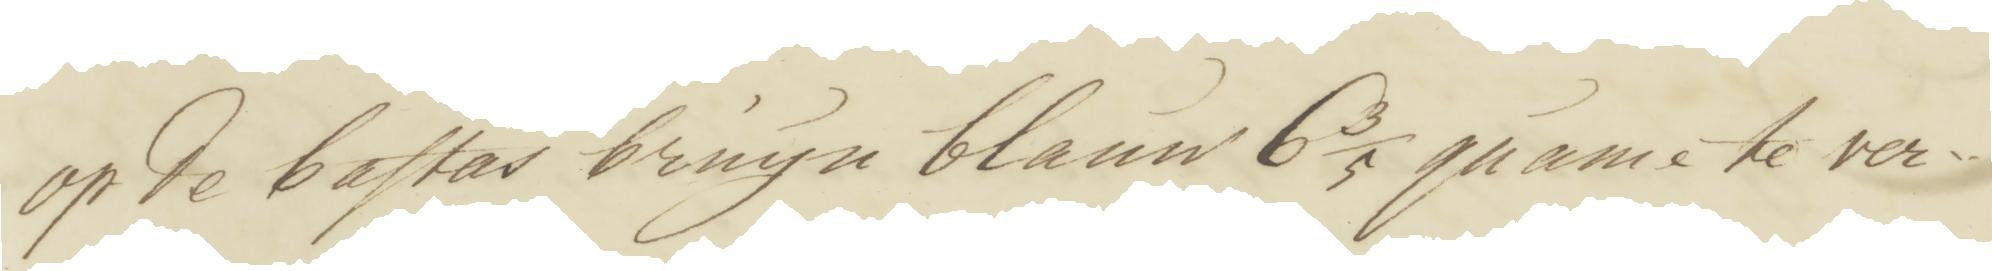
op de baftas bruijn blauw 6 3/5 quame te ver=
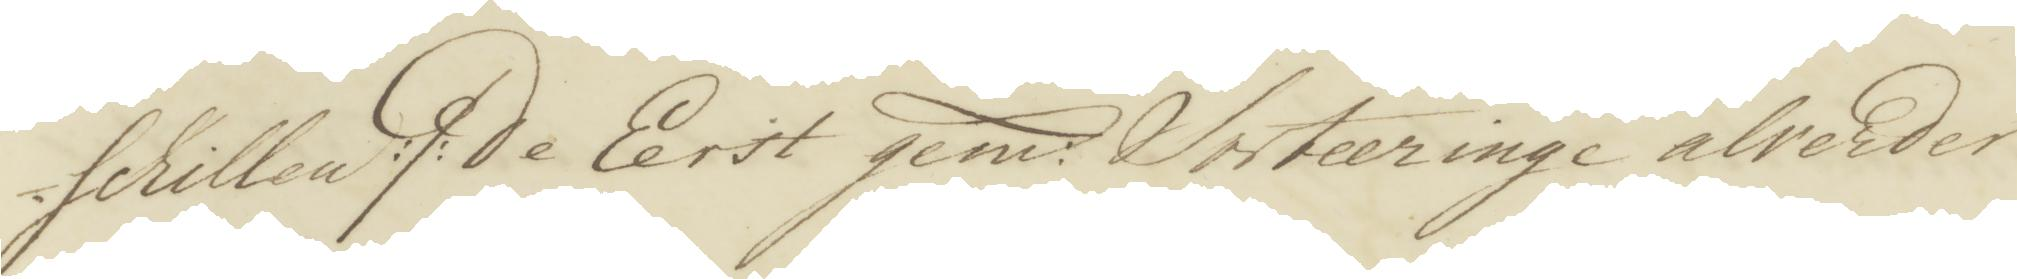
„schillen :/: de Eerst gem: Sorteeringe alverder
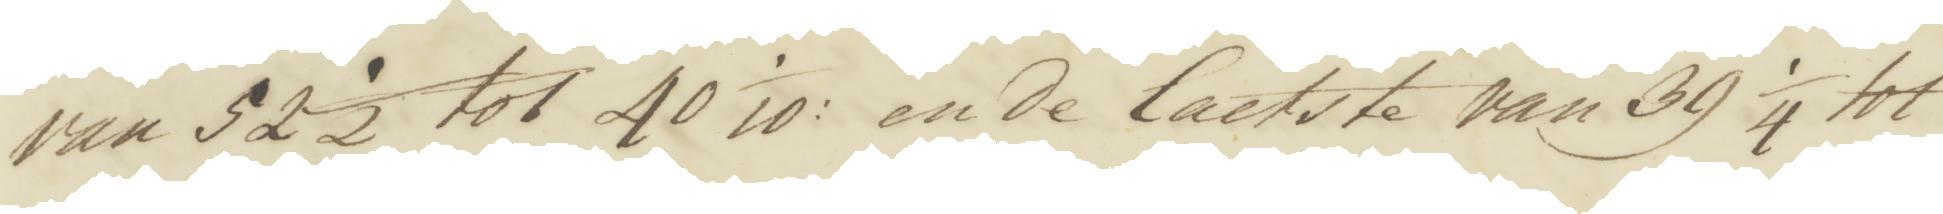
van 52 ½ tot 40 1/10: en de laetste van 39 1/4 tot
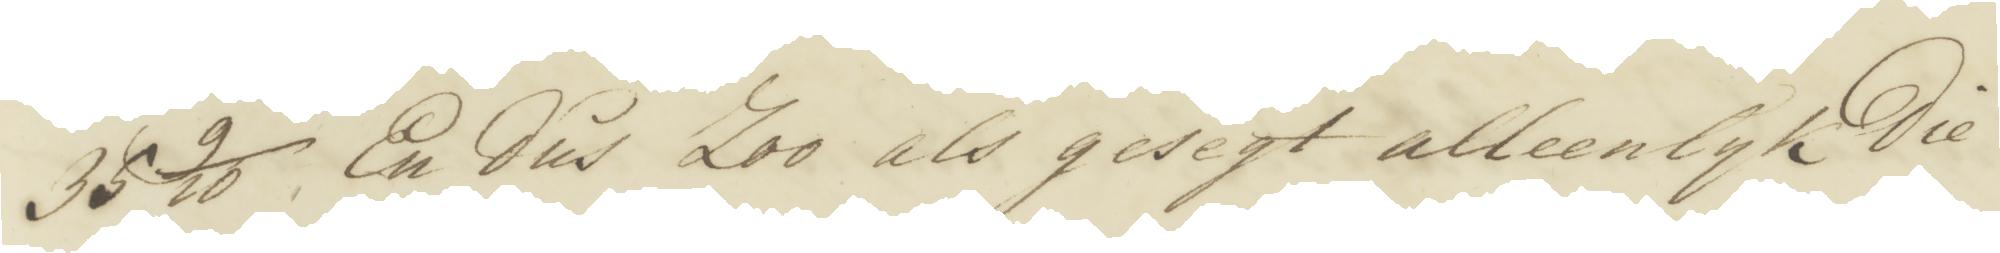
35 9/10 En dus Zoo als gesegt alleenlyk die
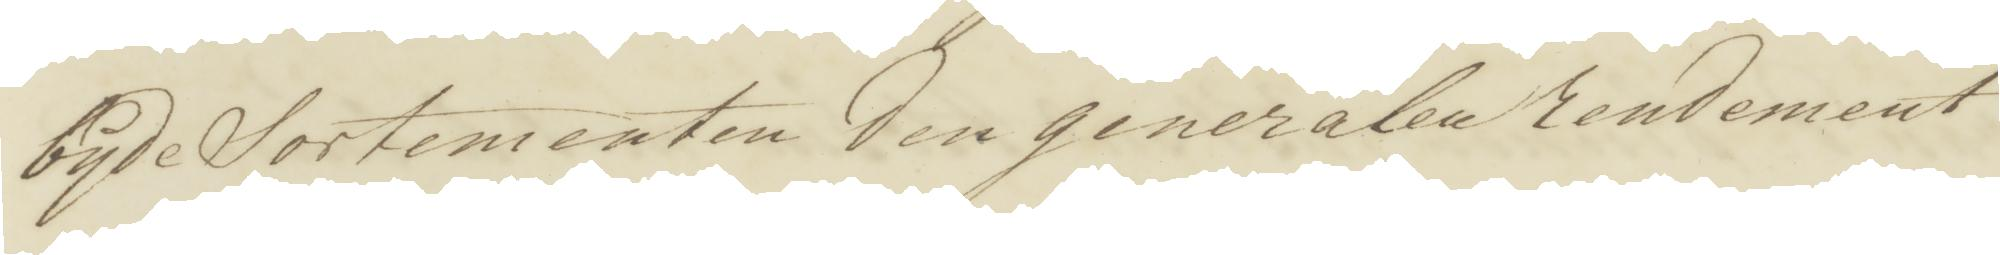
bij de Sortementen den generalen rendement
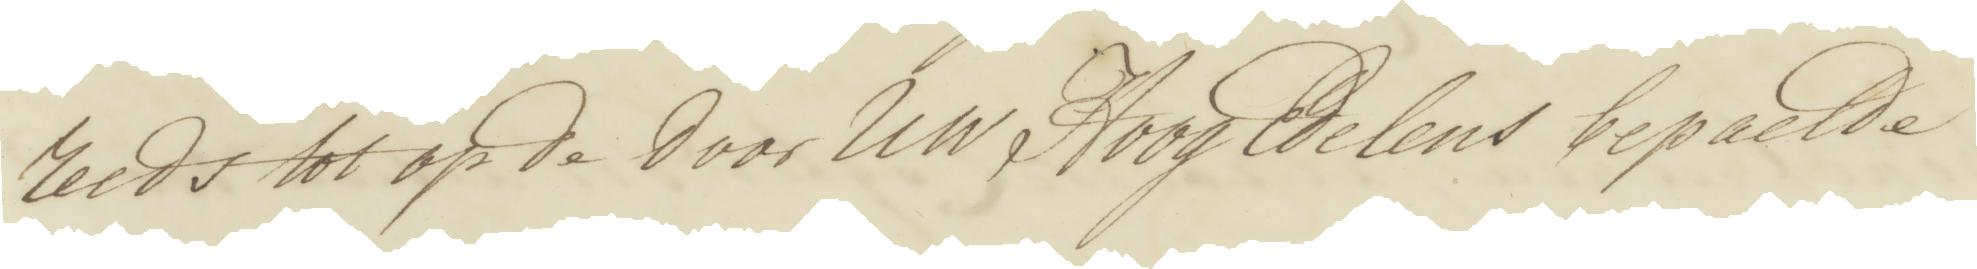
reeds tot op de door UW Hoog Edelens bepaelde
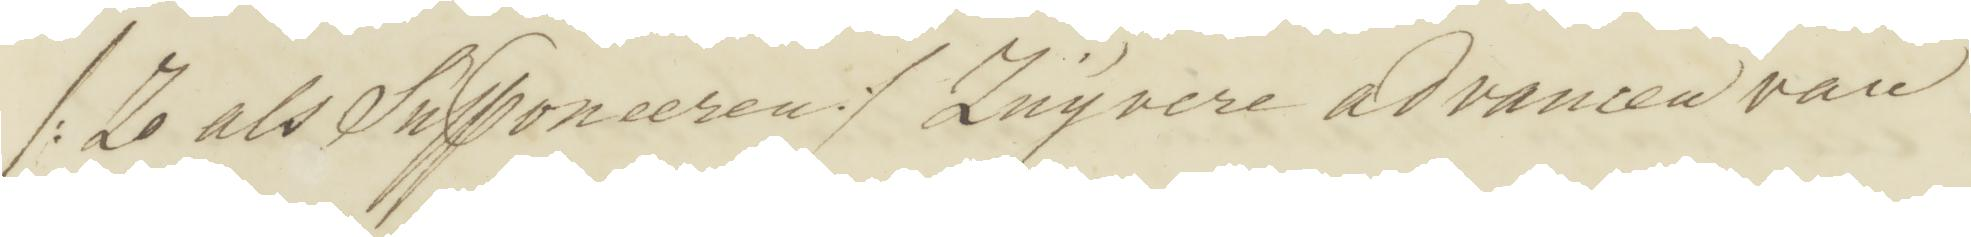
/: Zo als Supponeeren :/ Zuijvere advancen van
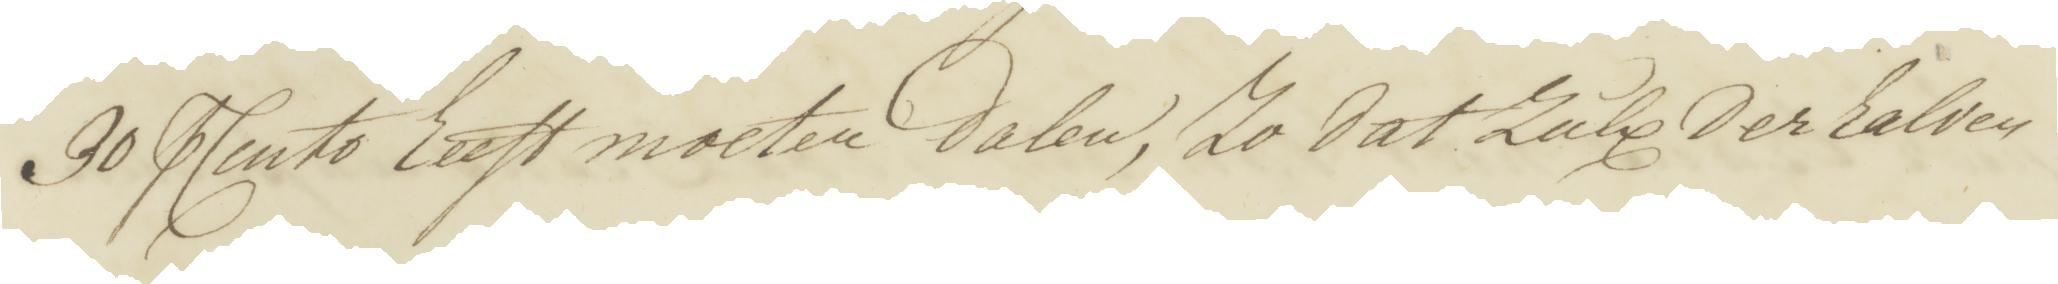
30 pCento heeft moeten dalen, Zo dat zulx derhalven
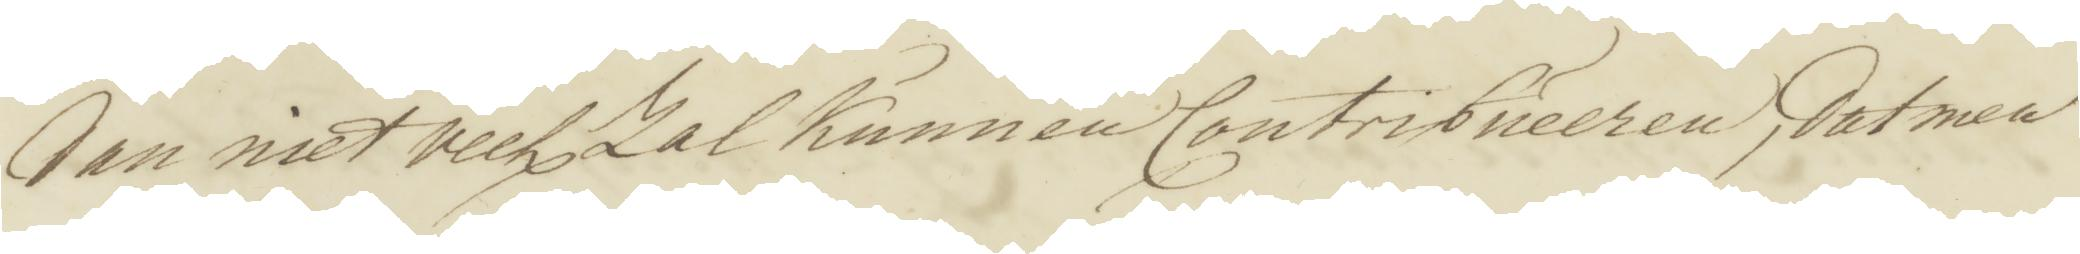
dan niet veel Zal kunnen contribueeren, dat men
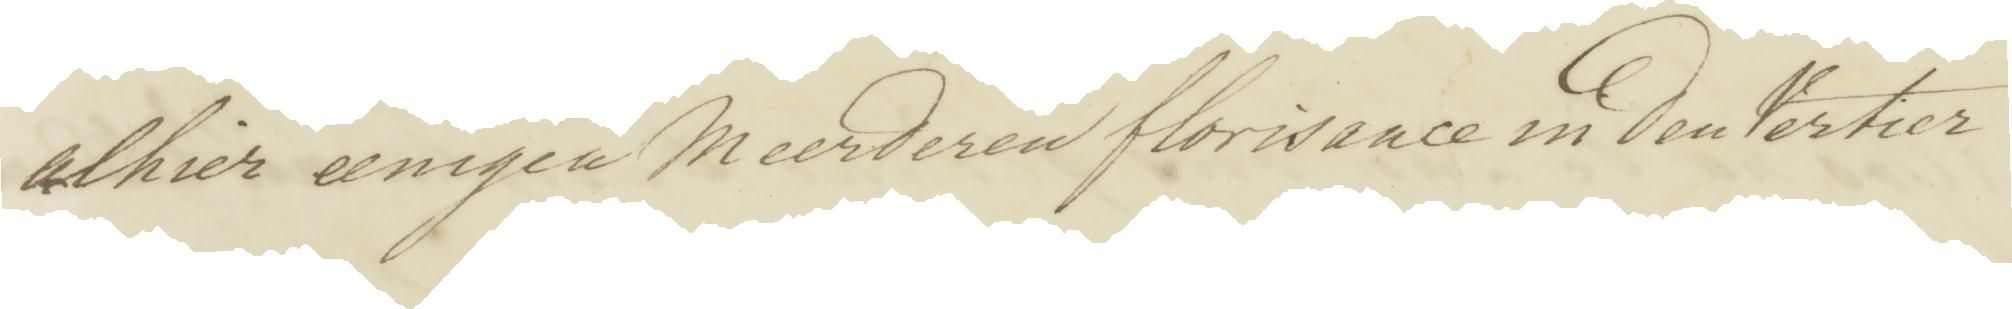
alhier eenigen Meerderen florisance in den Vertier
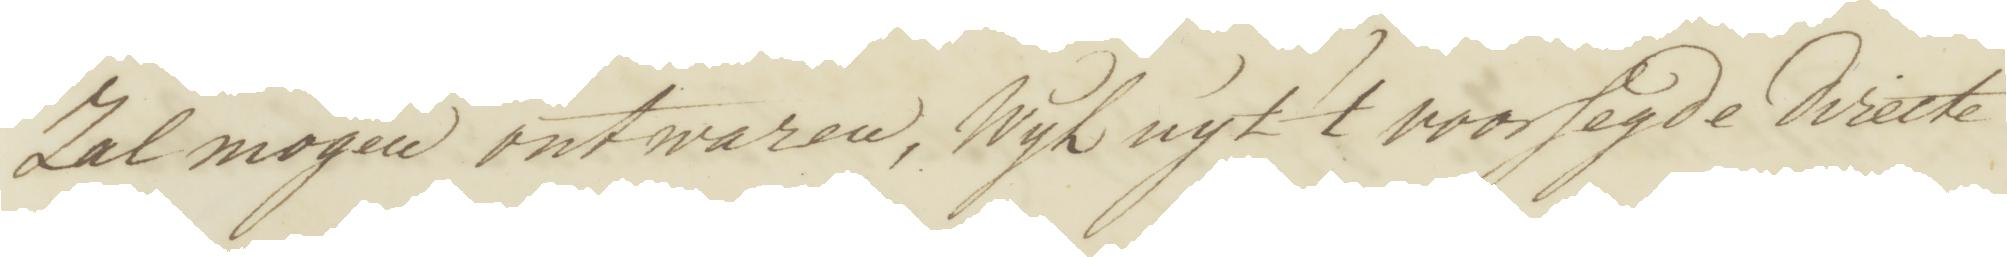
Zal mogen ontwaren, wyl uyt ’t voorsegde directe
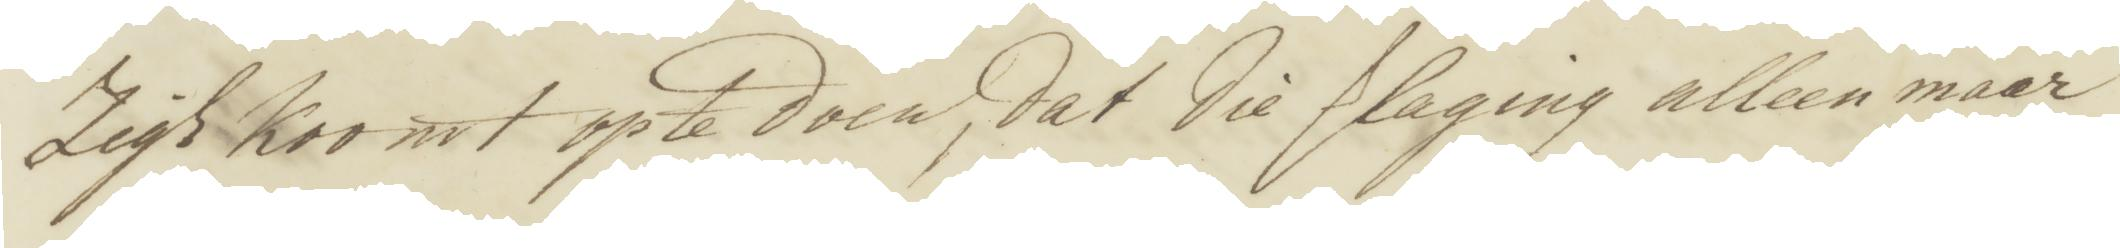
Zigh koomt op te doen, dat die verlaging alleen maar
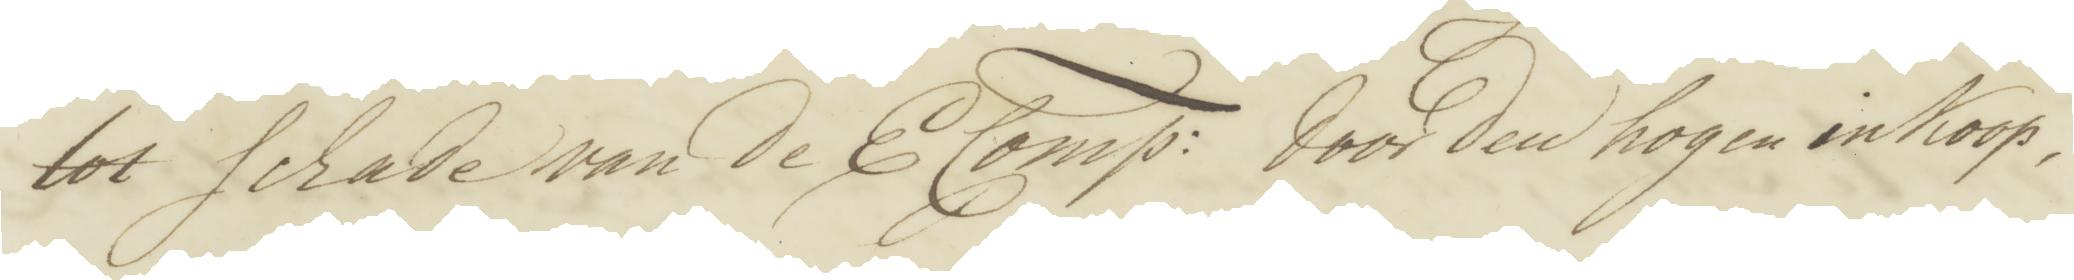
tot schade van de E: Comp: door den hogen inkoop.
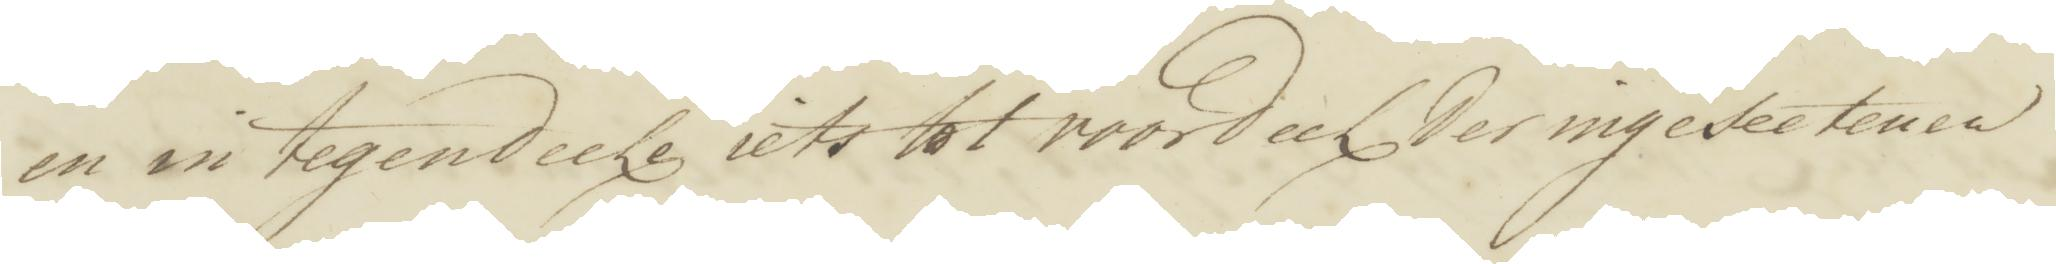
en in tegendeele iets tot voordeel der ingeseetenen
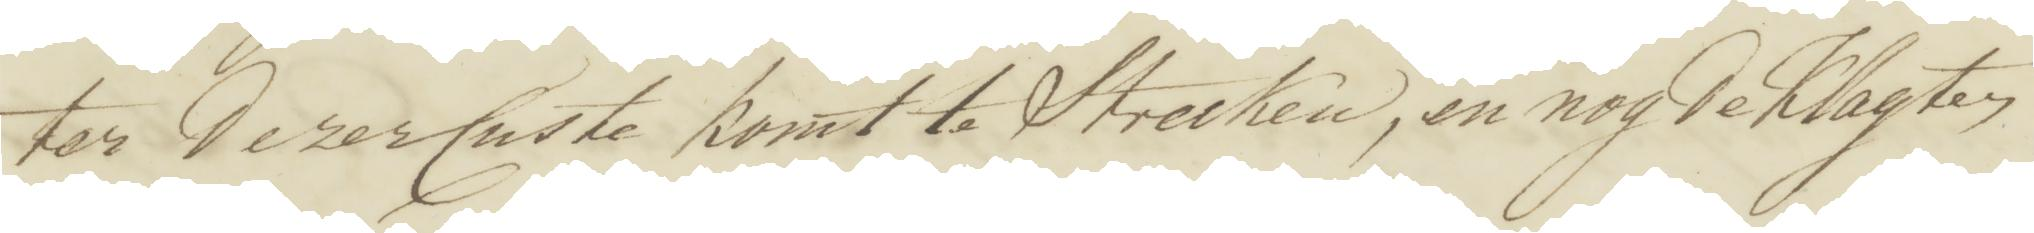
tot dezer custe komt te strecken, en nog de Klagten
